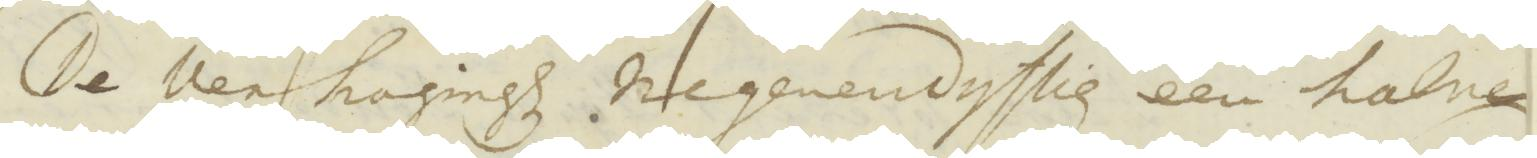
De verhoging negenenvyftig een halve
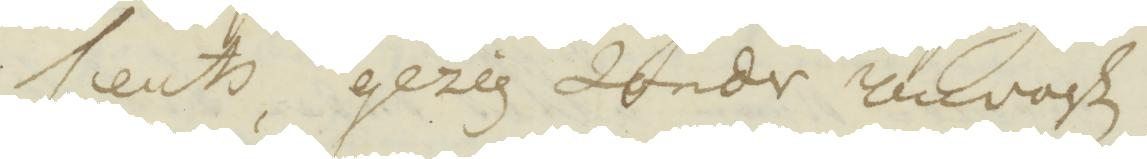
Cents, gezien zonder renvoy
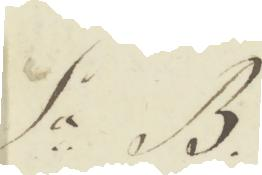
La B.
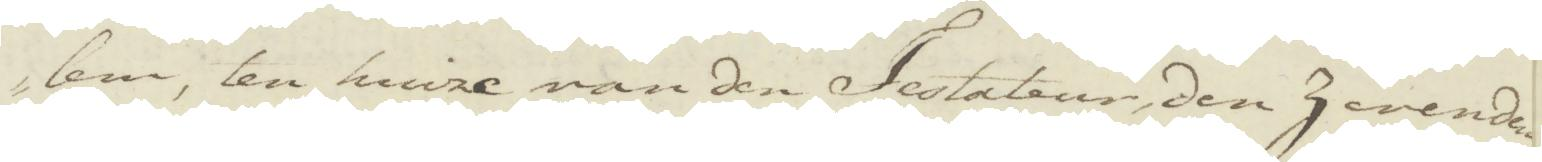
„lem, ten huize van den Testateur, den zevende
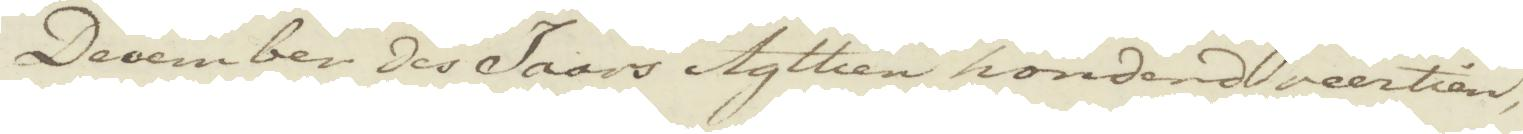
December des Jaars Agttien honderd veertien,
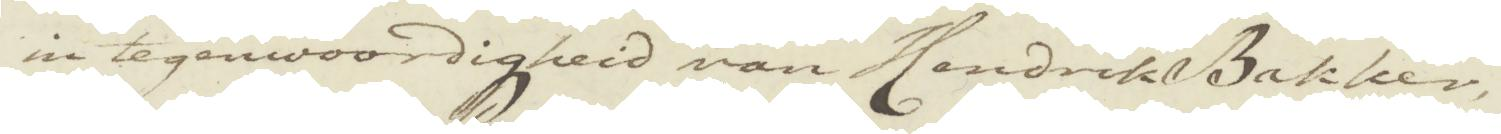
in tegenwoordigheid van Hendrik Bakker,
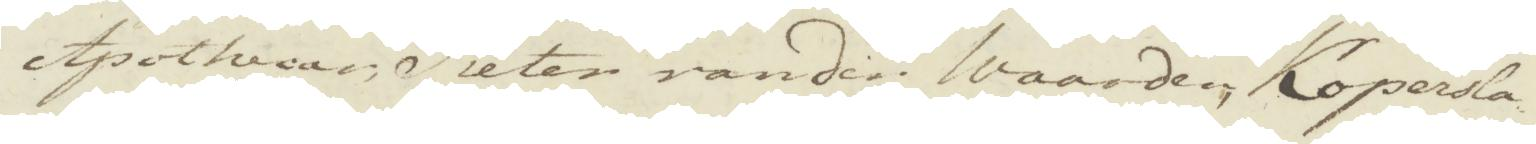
Apothecar, Pieter van der Waarden Kopersla„
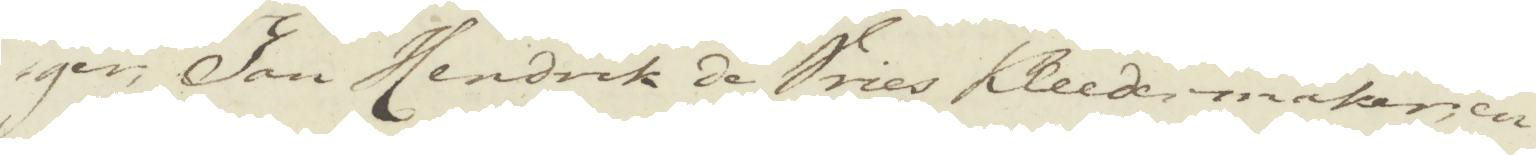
„ger; Jan Hendrik de Vries Kleedermaker; en
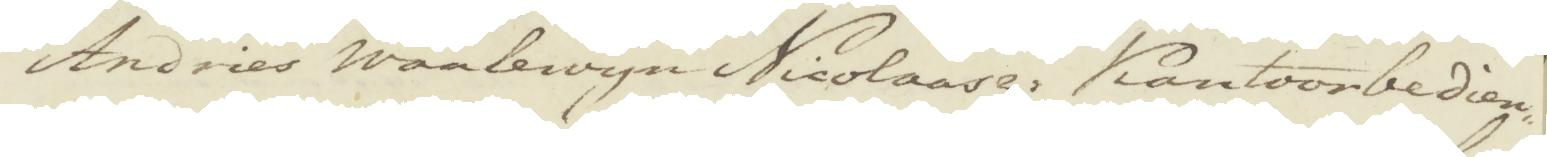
Andries Waalewyn Nicolaasz, Kantoorbedien„
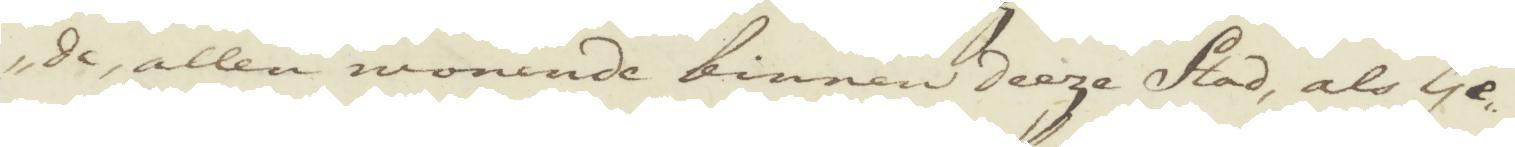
„de, allen wonende binnen deeze stad, als Ge„
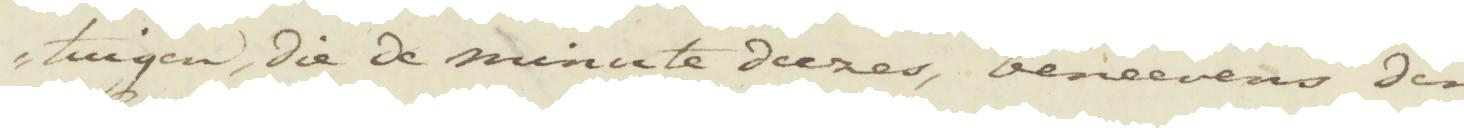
„tuigen, die de minute deezes, beneevens den
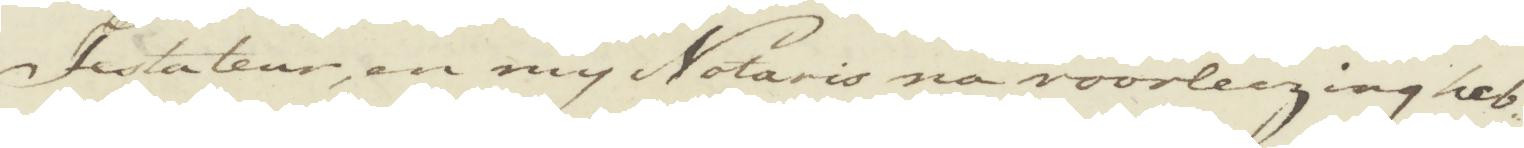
Testateur, en my Notaris na voorleezing heb„
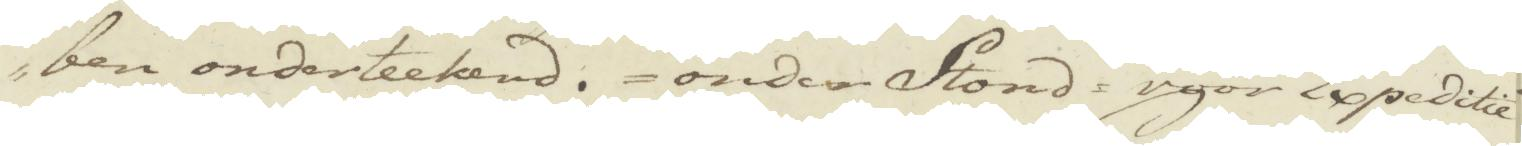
„ben onderteekend. = onder stond = voor Expeditie
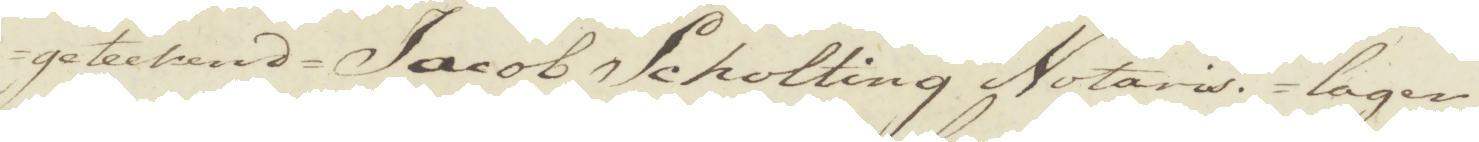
=geteekend= Jacob Scholting Notaris. = lager
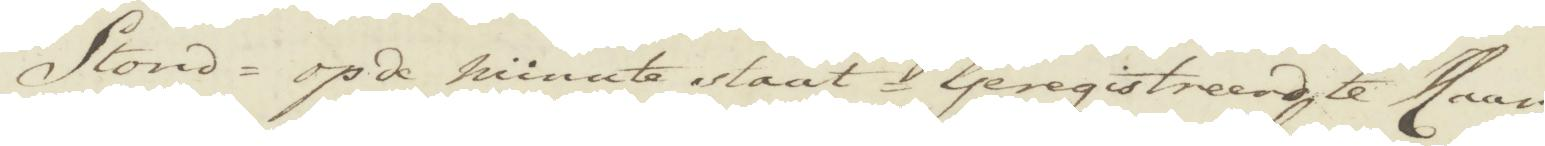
stond = op de minute staat = Geregistreerd, te Haar
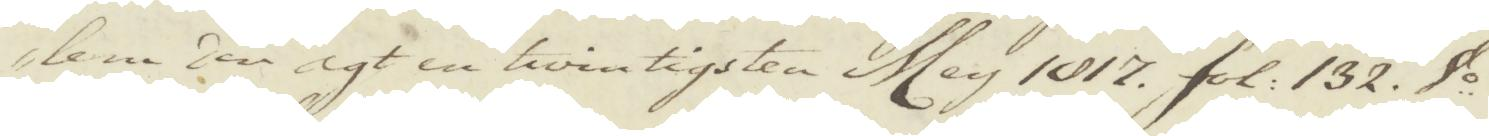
„lem den agt en twintigsten Mey 1817. fol: 132. V:o
